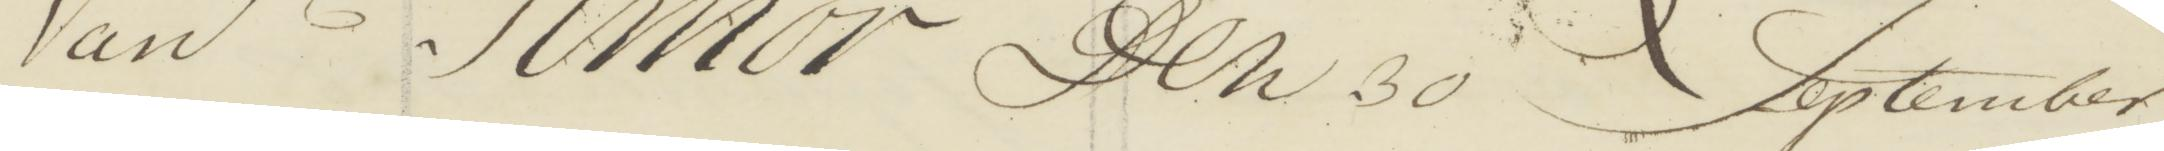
Van Timor Den 30 September
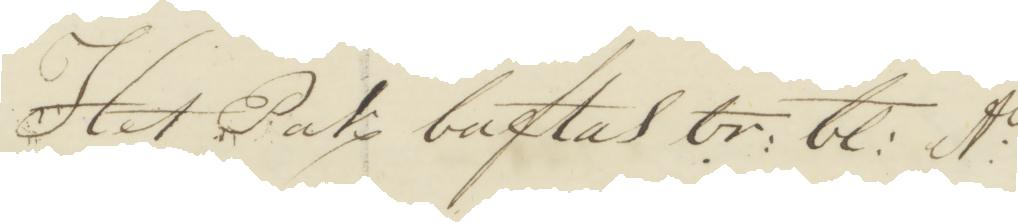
Het Pak baftas br: bl: A:o
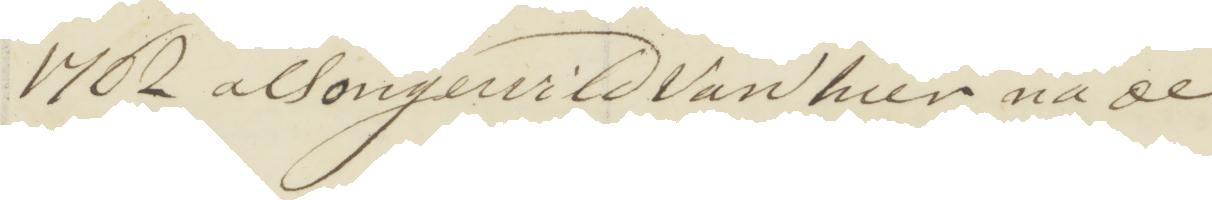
1762 als ongewild van hier na de
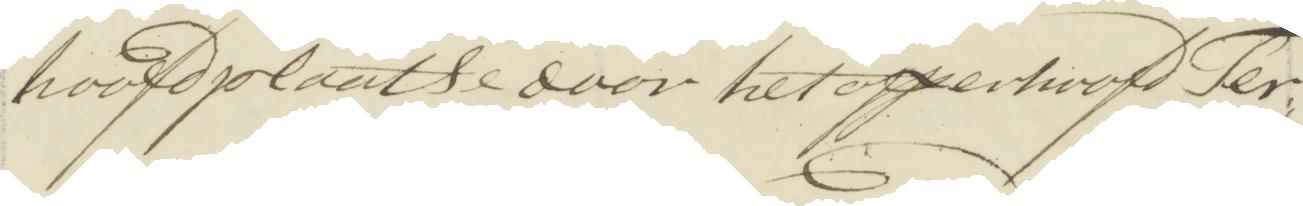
hoofdplaatse door het opperhoofd Ter„
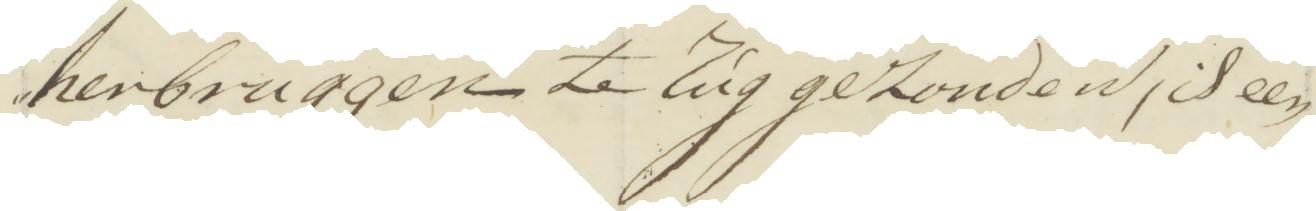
„herbruggen te rug gezonden, is een
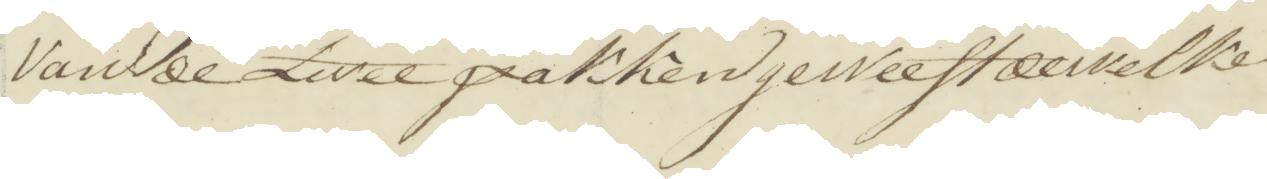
van de twee pakken geweest dewelke
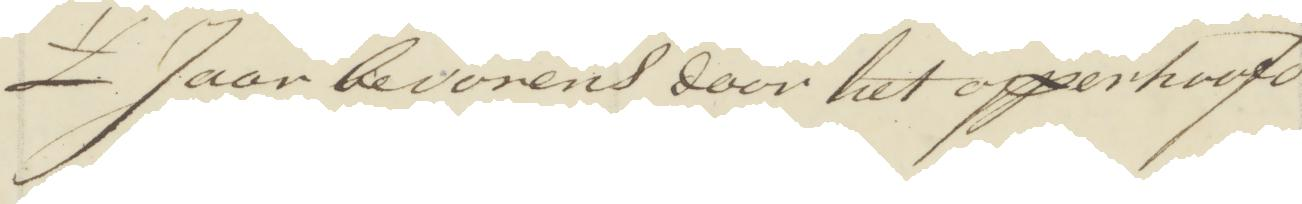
't Jaar bevorens door het opperhoofd
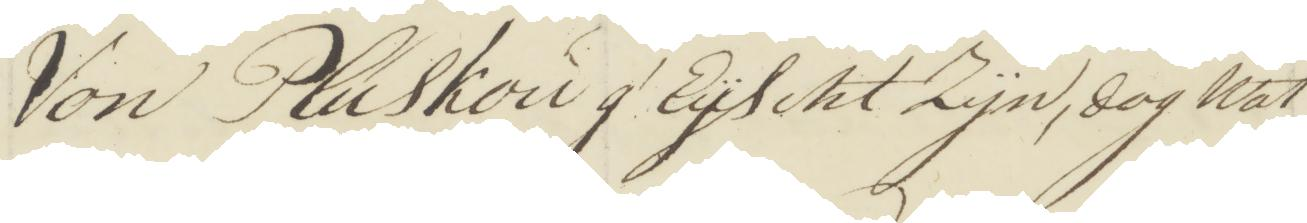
Von Pluskou g’ Eijscht zijn, dog wat
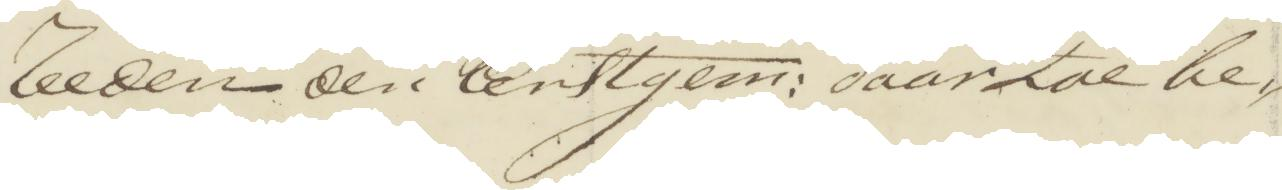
reeden den Eerstgem: daar toe be
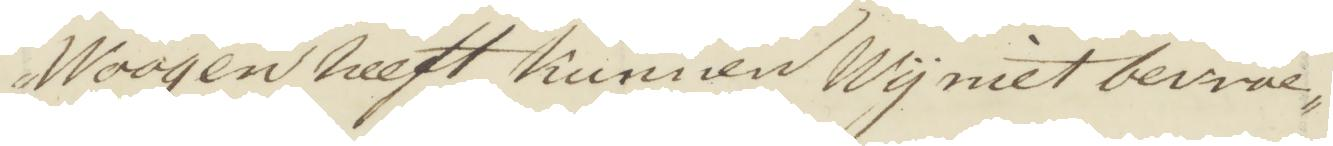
woogen heeft kunnen wij niet bevroe„
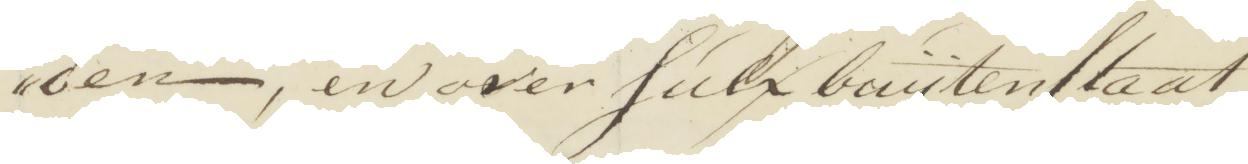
„den, en over sulx buijten staat
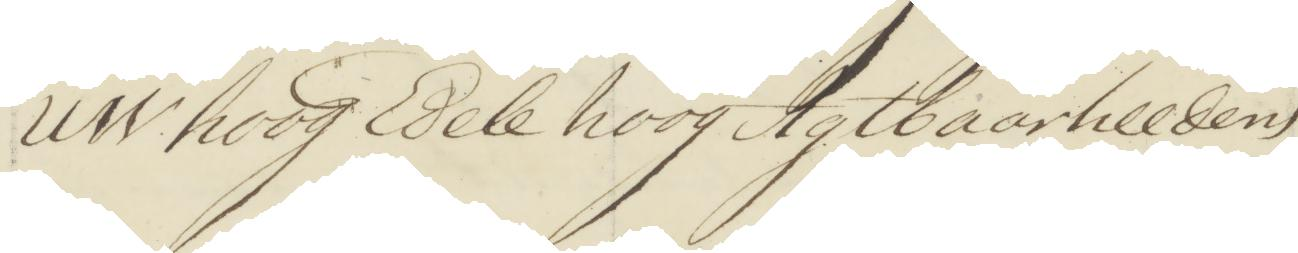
uw hoog Edele hoog Agtbaarheedens
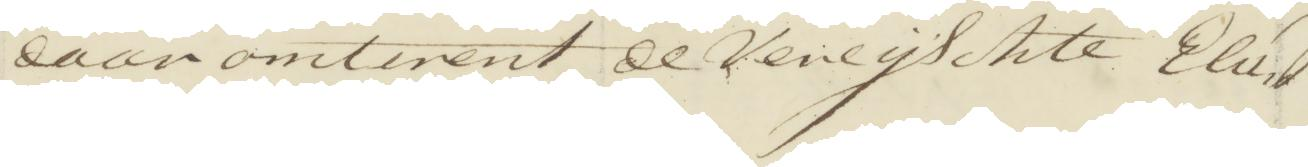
daar omterent de vereijschte Elu
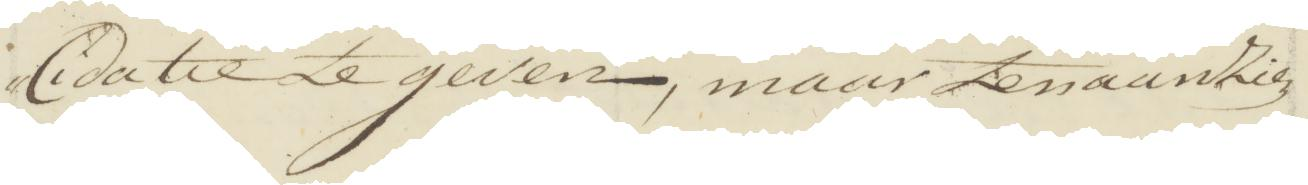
„Cidatie te geven, maar ten aanzien
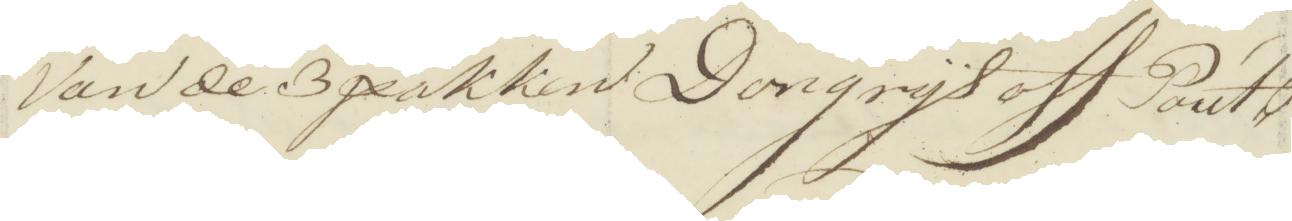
van de 3 pakken Dongrijs off Pout„
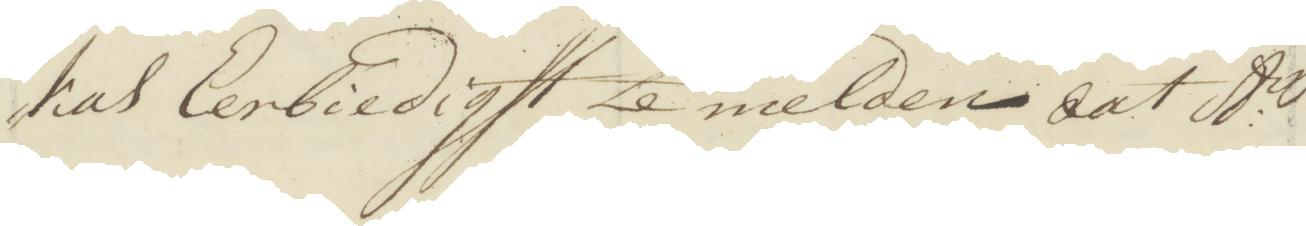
„kas Eerbiedigst te melden dat A:o
